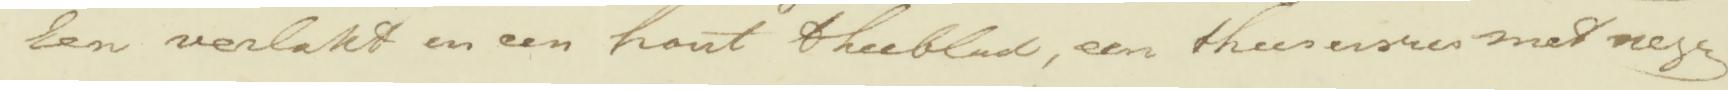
Een verlakt en een hout theeblad, een theeservies met negen
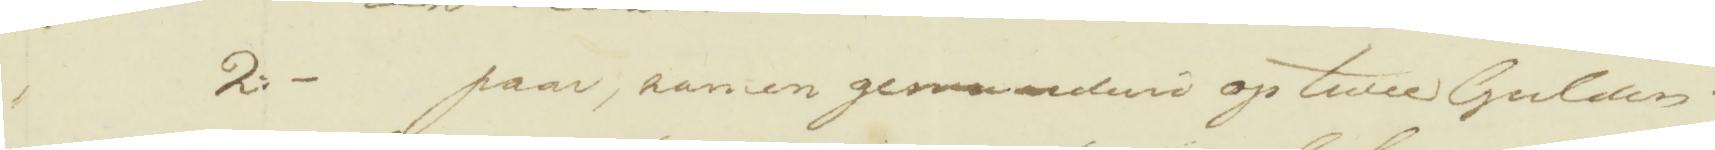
„ 2: - paar, zamen gewaardeerd op twee Gulden
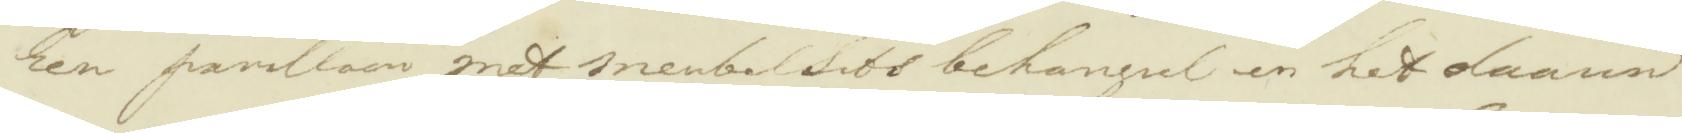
Een pavilloen met meubel sits behangel en het daarin
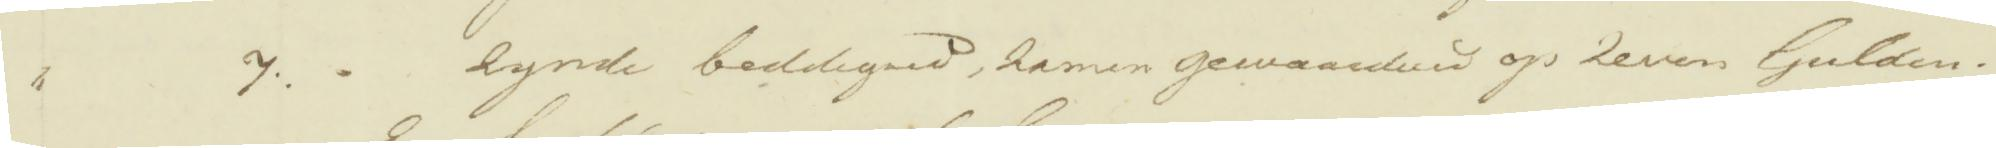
„ 7: - zynde beddegred, zamen gewaardeerd op zeven Gulden.
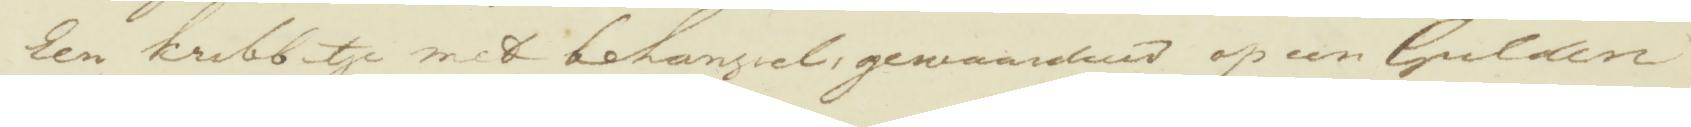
Een kribbetje met behangsel, gewaardeerd op een Gulden
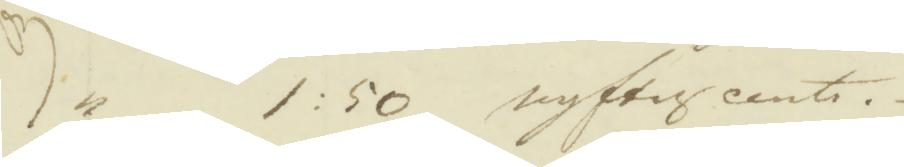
„ 1: 50 vyftig cents.
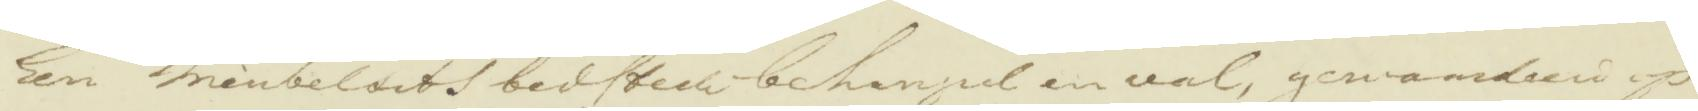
Een meubelsits bedstede behangsel en val, gewaardeerd op
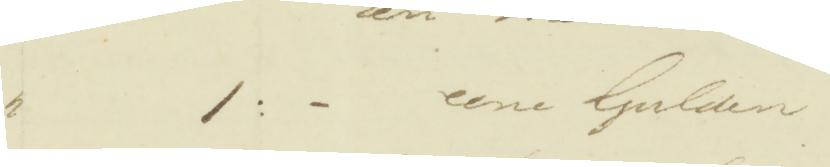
1: - eene Gulden
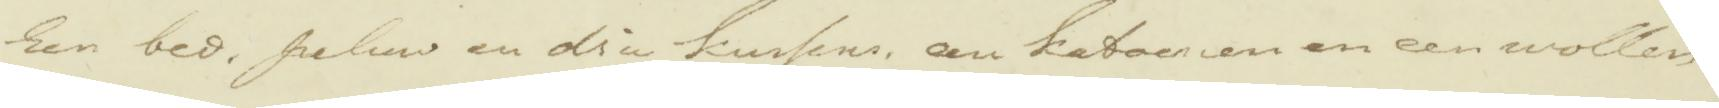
Een bed, peluw en drie kussens, een katoenen en een wollen
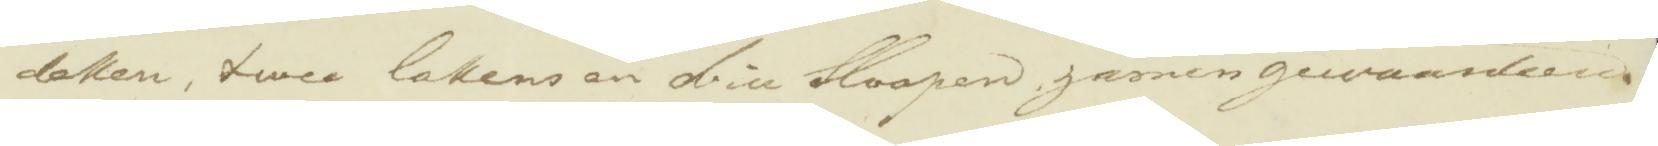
deken, twee lakens en drie sloopen, zamen gewaardeerd
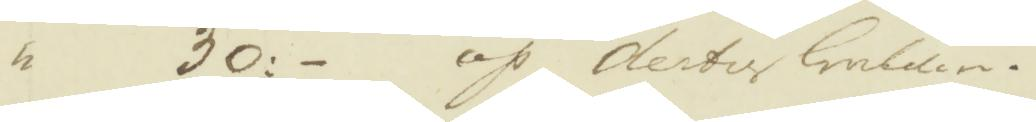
30: - op dertig Gulden.
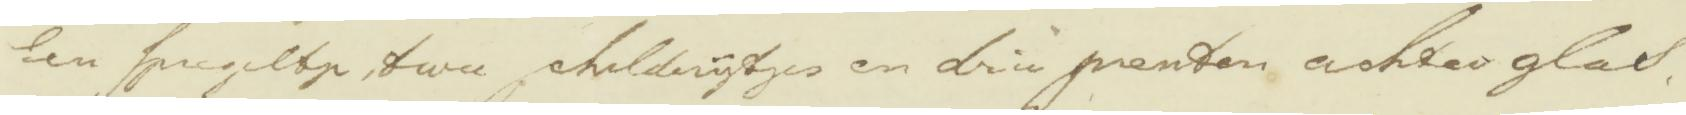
Een spiegeltje, twee schilderijtjes en drie prenten achter glas.
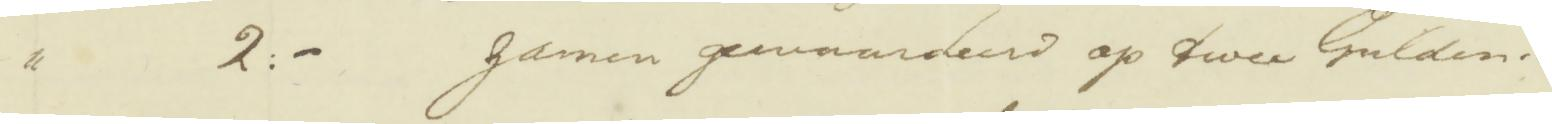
„ 2: - zamen gewaardeerd op twee Gulden.
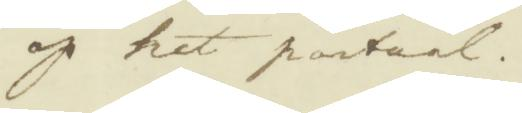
op het portaal.
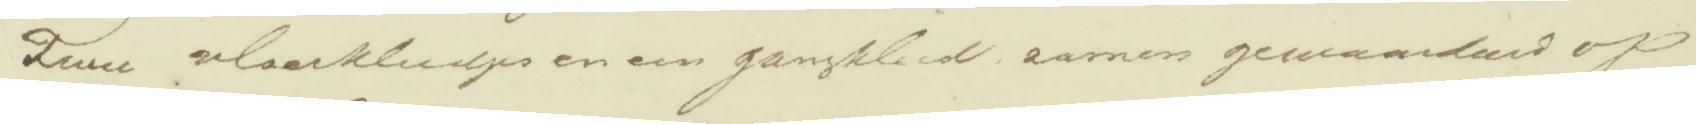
Twee vloerkleedjes en een gangkleed, zamen gewaardeerd of
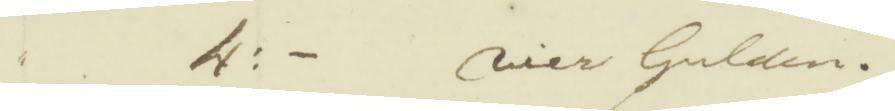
„ 4: - vier Gulden.
